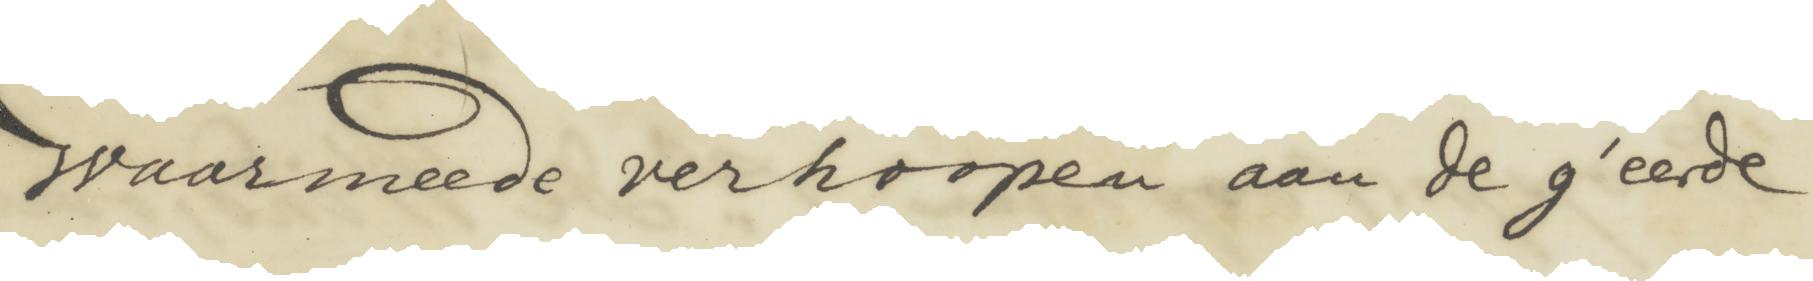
Waarmeede verhoopen aan de g’eerde
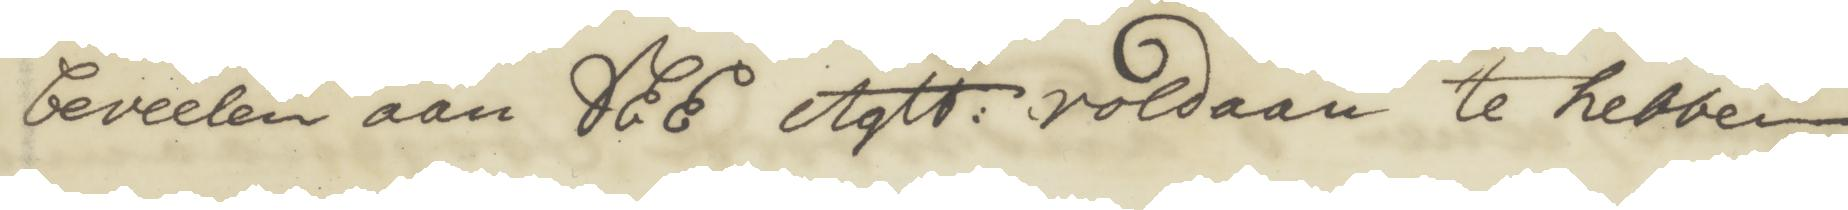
beveelen aan VEE Agtb: voldaan te hebben
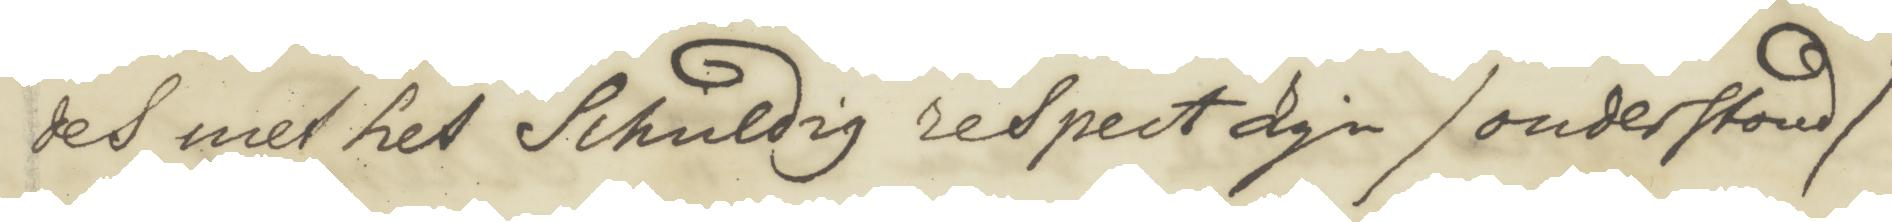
des met het schuldig respect zijn /onderstond/
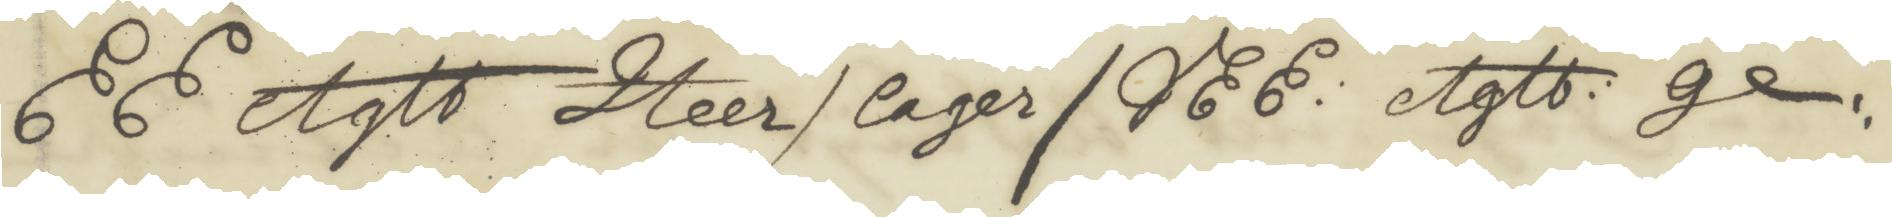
EE Agtb Heer / lager / VEE: Agtb: ge„
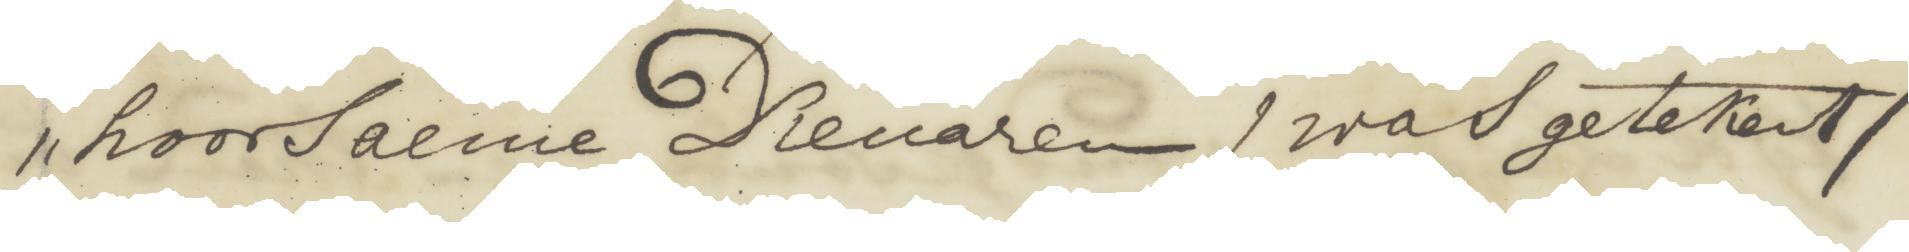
„hoorsaeme Dienaren /was getekent/
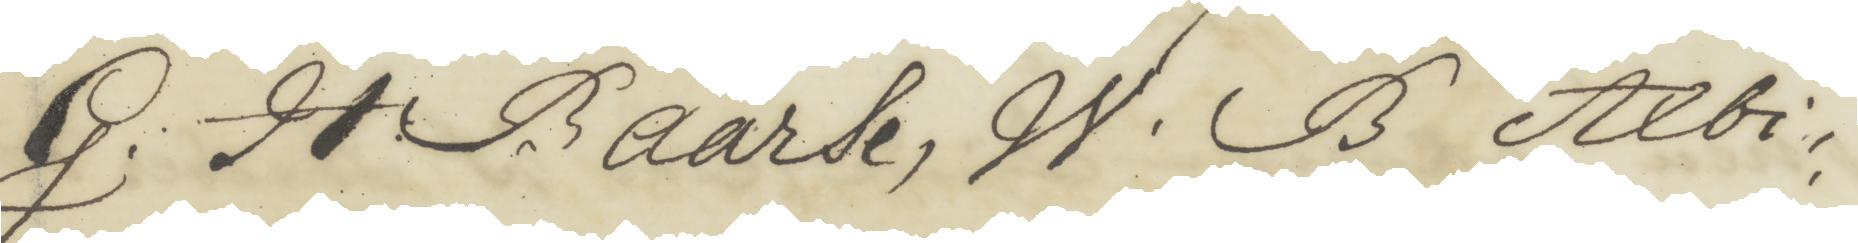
G: H. Baarse, W. B Albi„
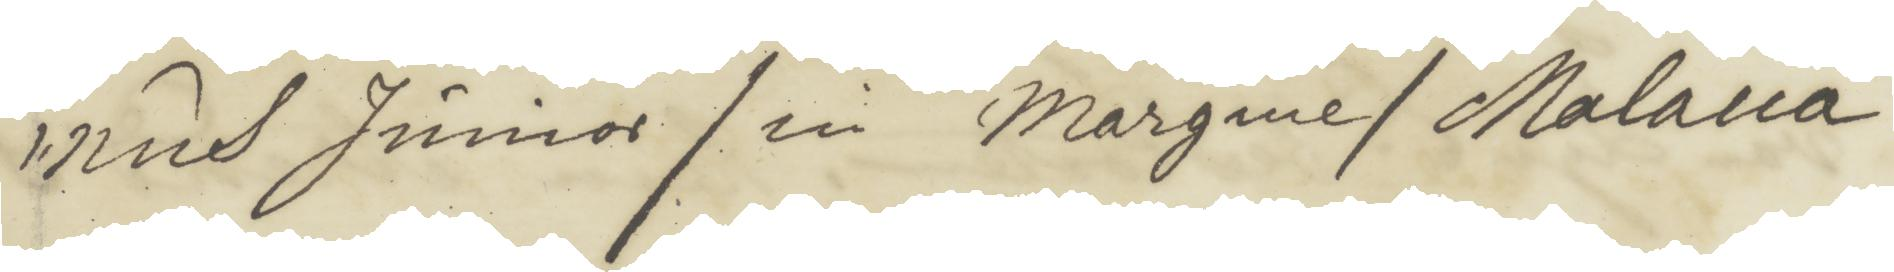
„nus Junios /in margine/ Malacca
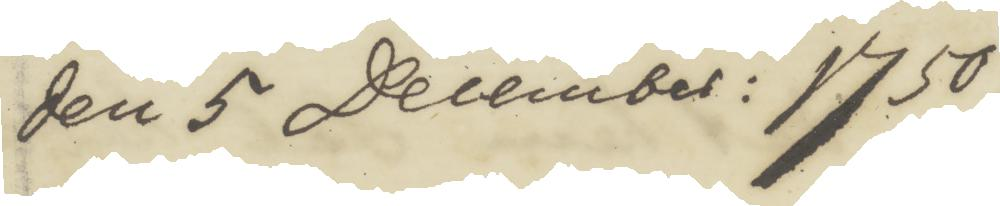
den 5 December: 1750
